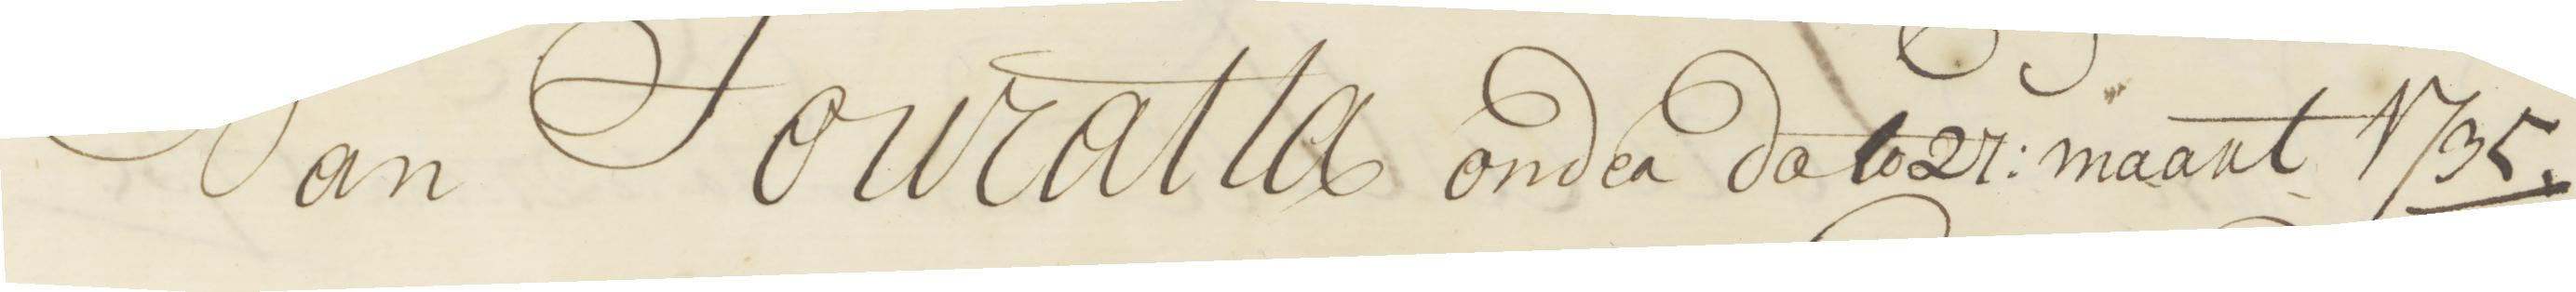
Van Souratta onder dato 27:e maart 1735.
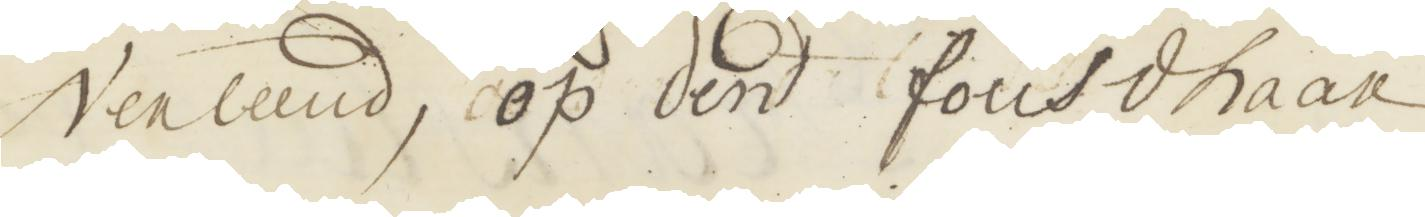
Verleend, op den fous dhaar
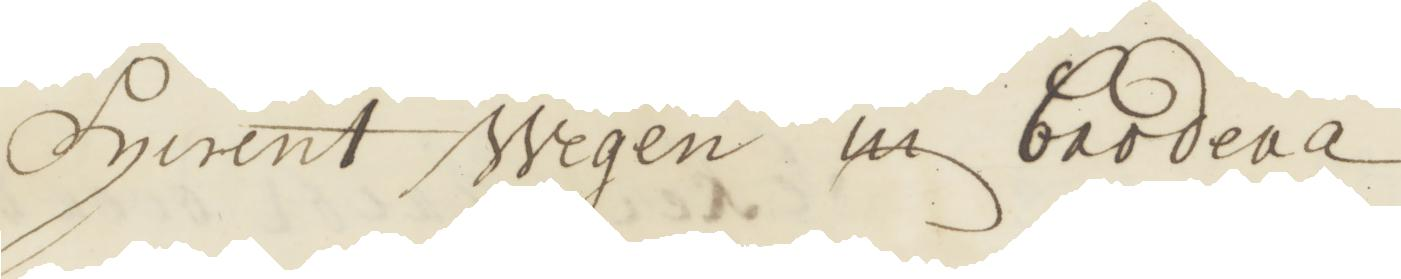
Synent Wegen in brodera
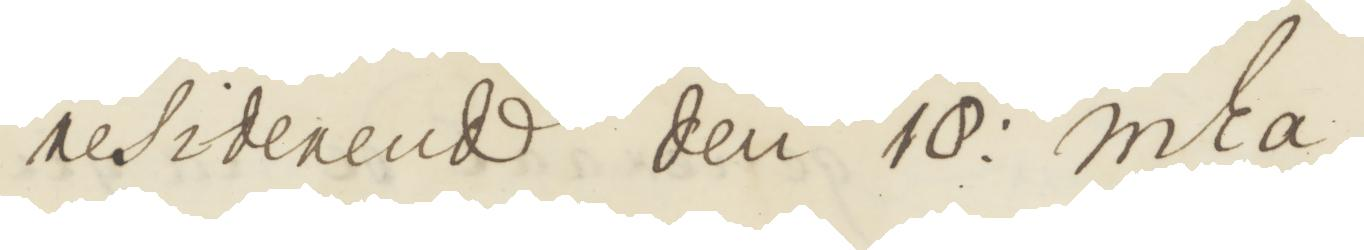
residerende den 18:e mha„
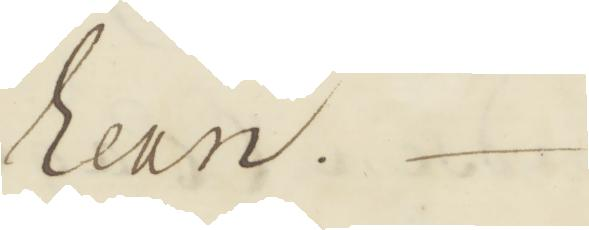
hern. —
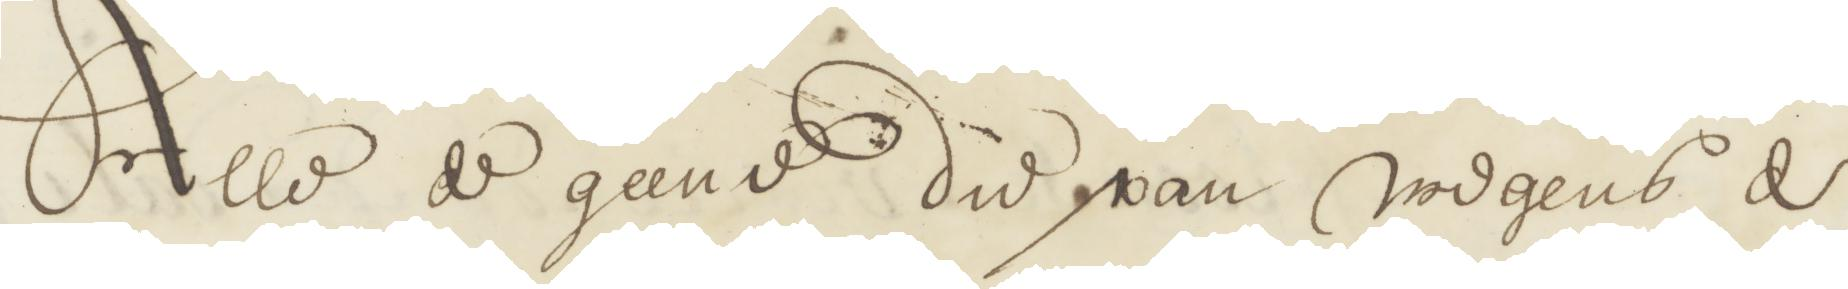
Alle de geene die van wegens de
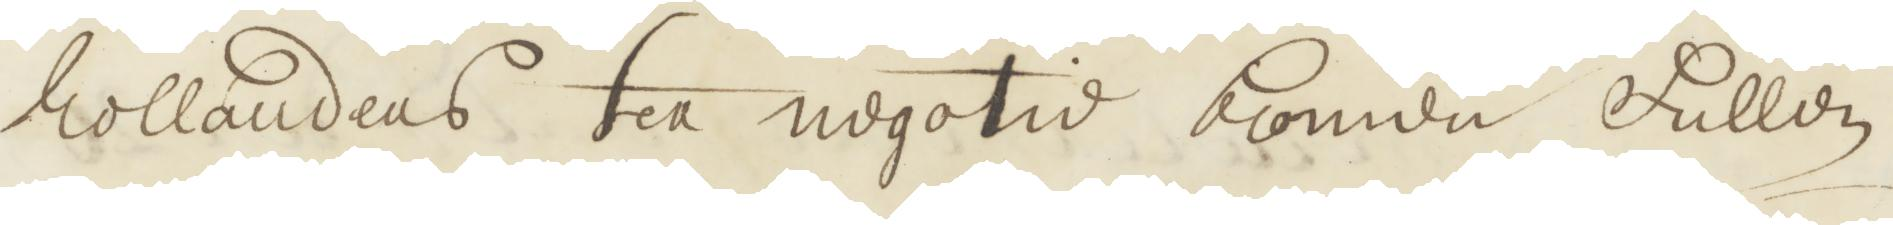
hollanders ter negotie konnen sullen
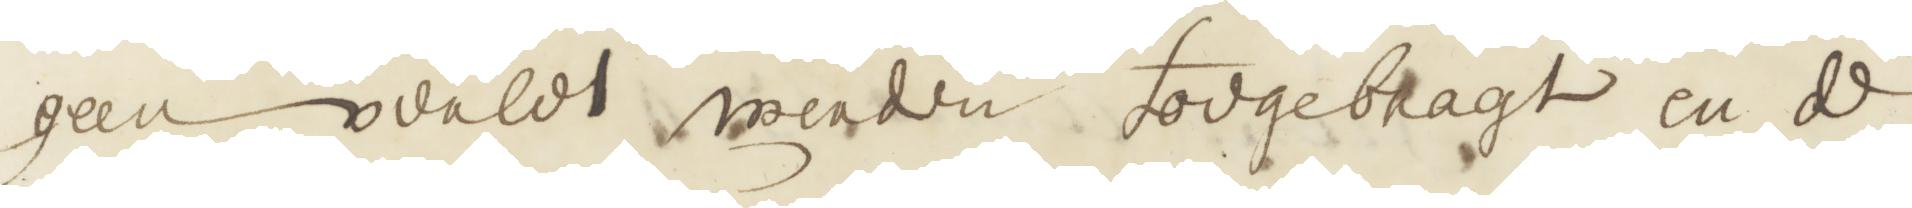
geen verlet werden toegebragt en de
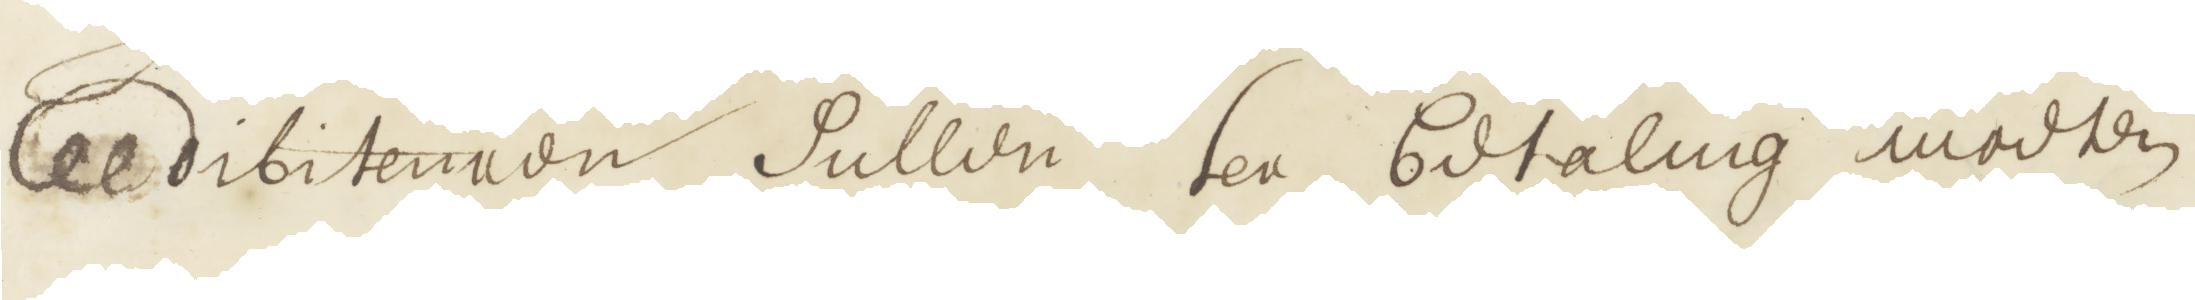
dibiteuren sullen ter betaling moeten
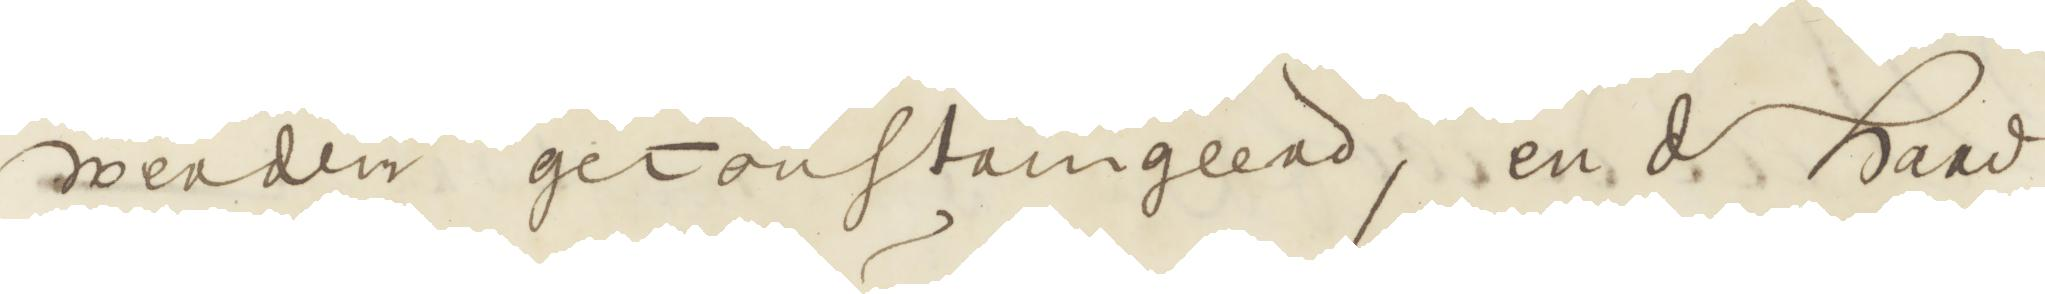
werden geconstringeerd, en de hare
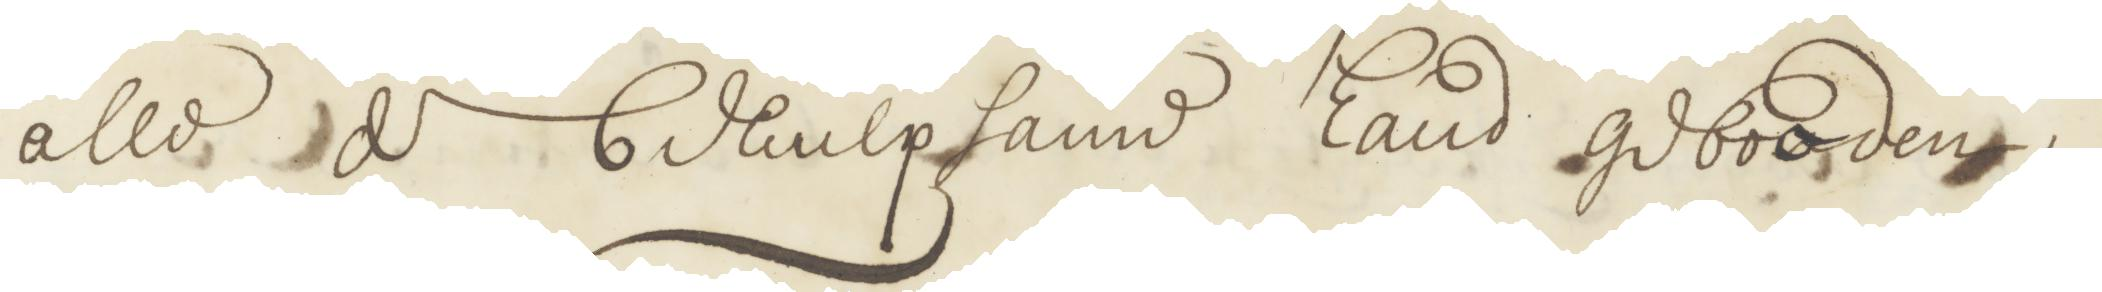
alle de behulpsame hand gebooden;
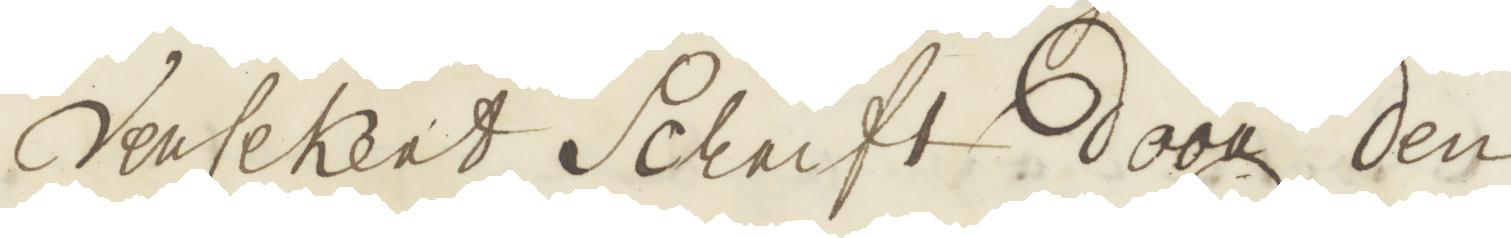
versekert schrift door den
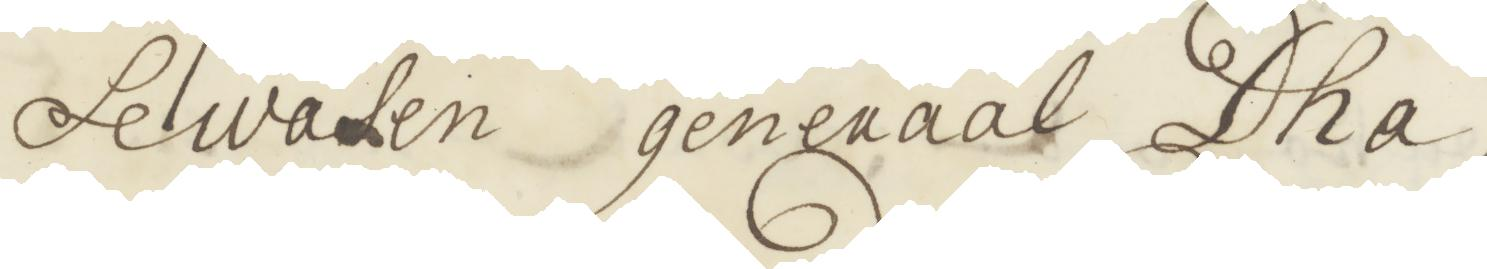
sewasen generaal Dha
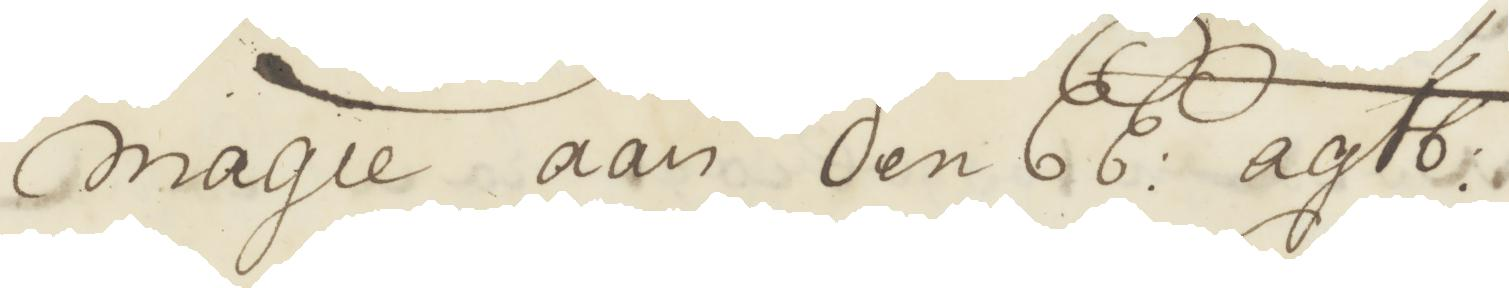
magie aan den EE: agtb:
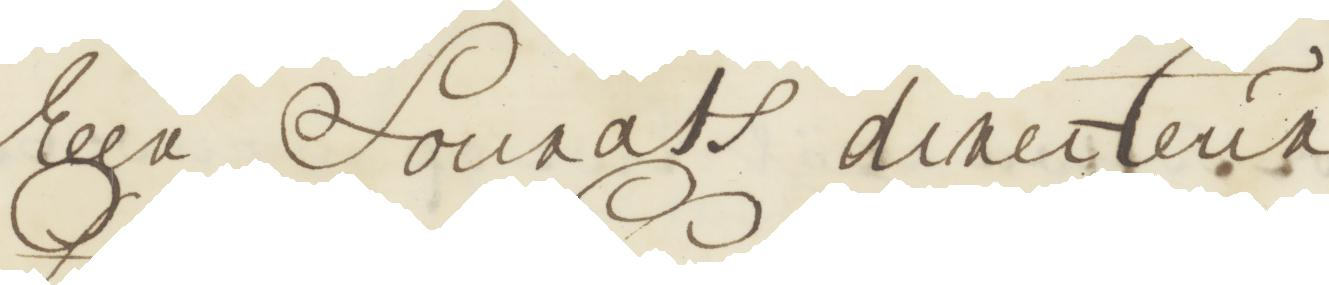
heer Sourats directeur
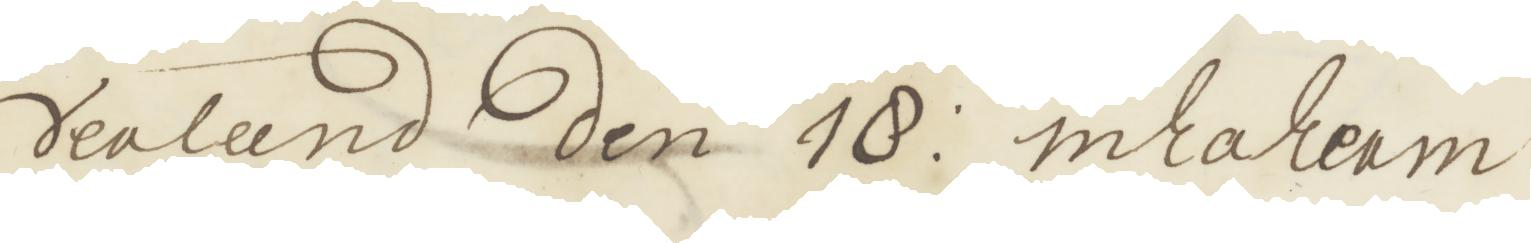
verleend den 18: mhaherm
